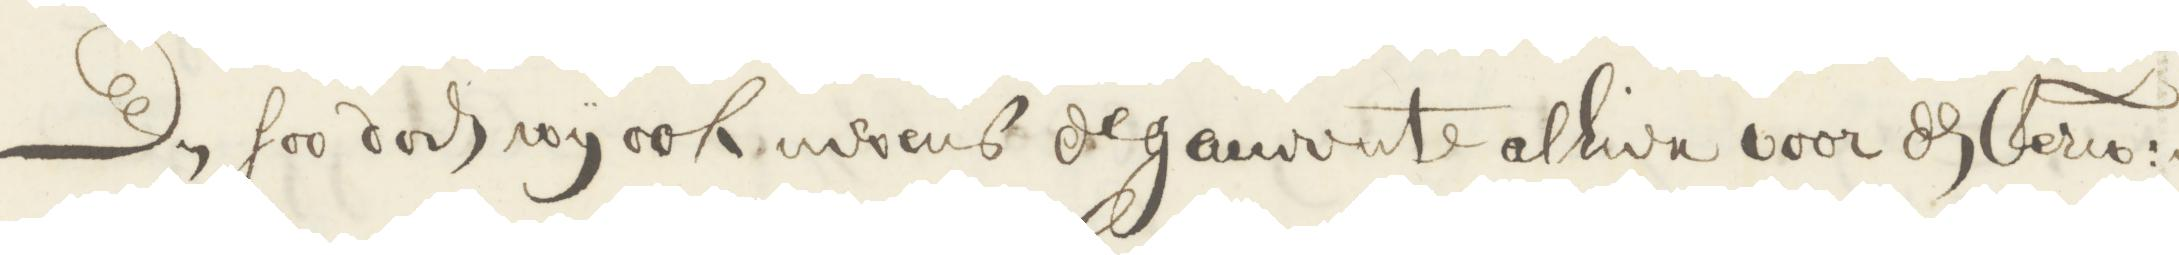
En soo doen wij ook nevens de gemeente alhier voor den Eerw:
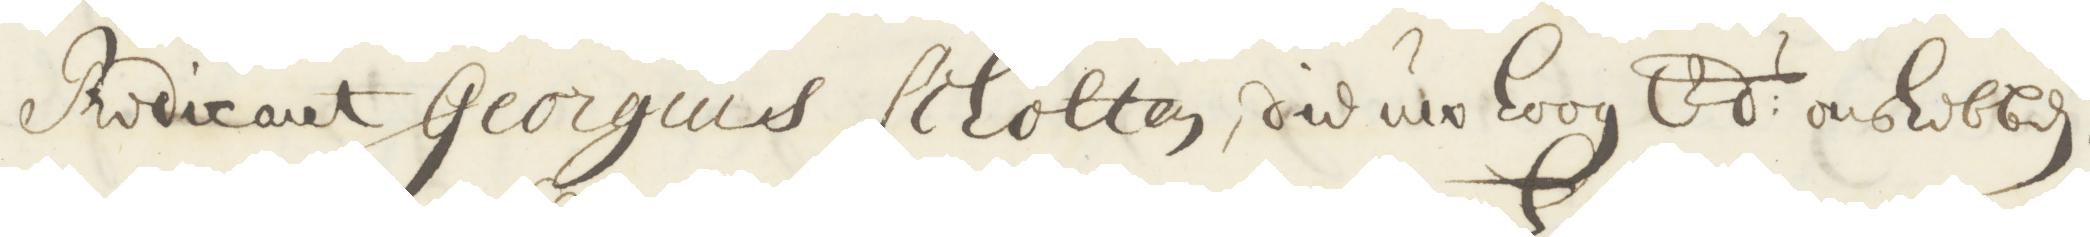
Predicant Georgius scholten, die uw hoog Ed: onshebben
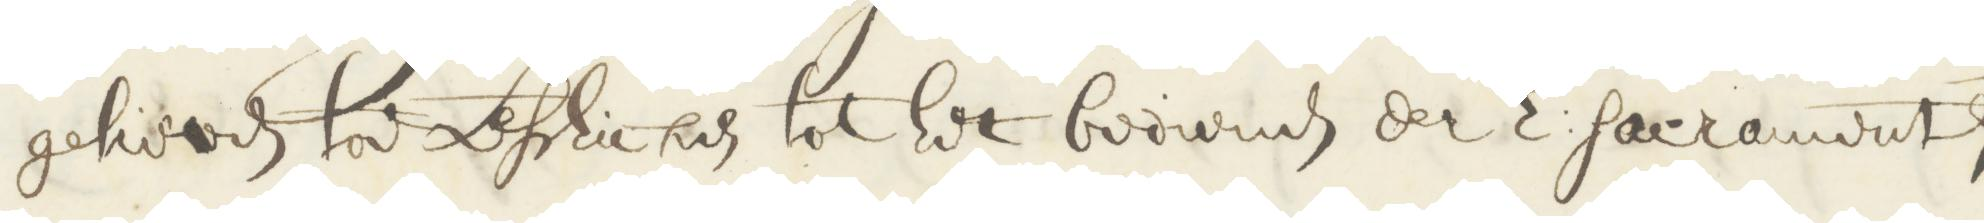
gelieven toe teschicken tot het bedienen der h: sacramenten,
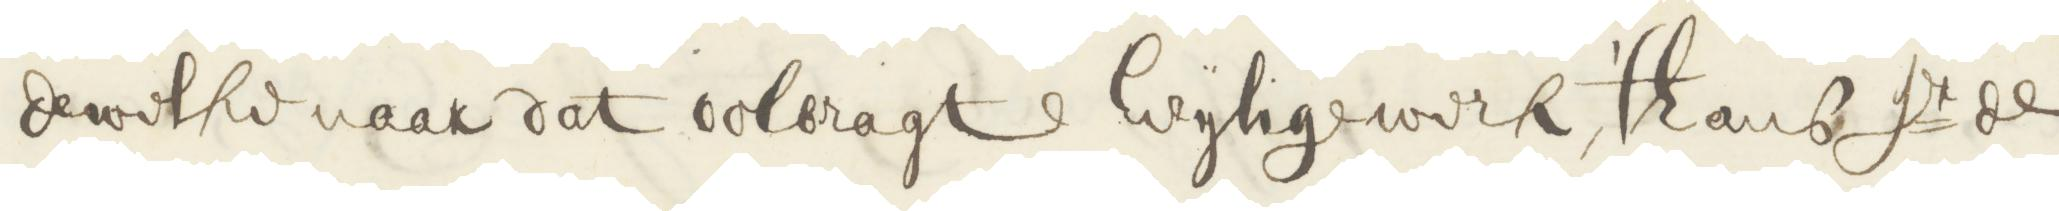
dewelke naar dat volbragte heijlige werk, 'thans p=r de
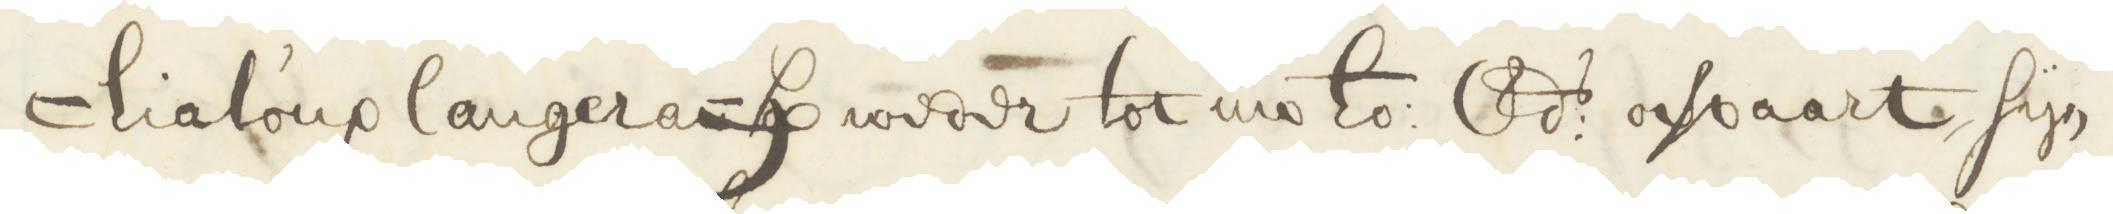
chialoup langerack weder tot uw ho: Ed:s overvaart, sijn
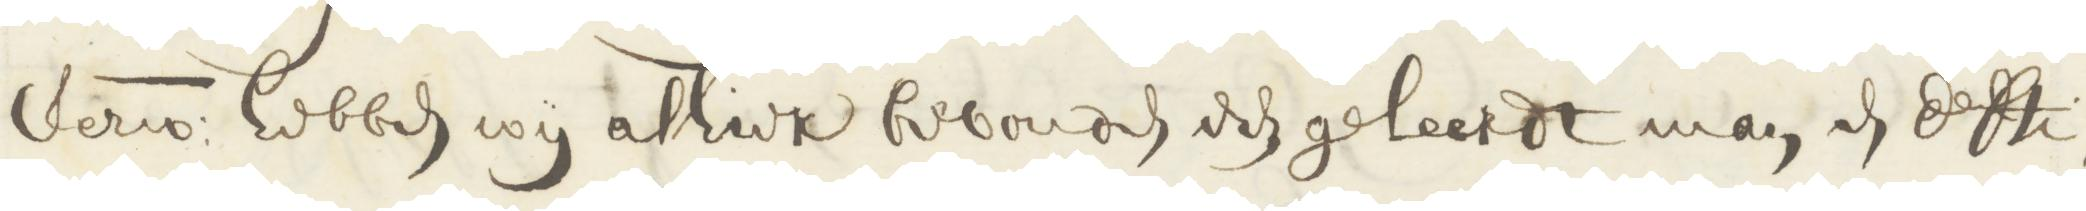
Eerw: hebben wij alhier bevonden een geleerdt man en defti„
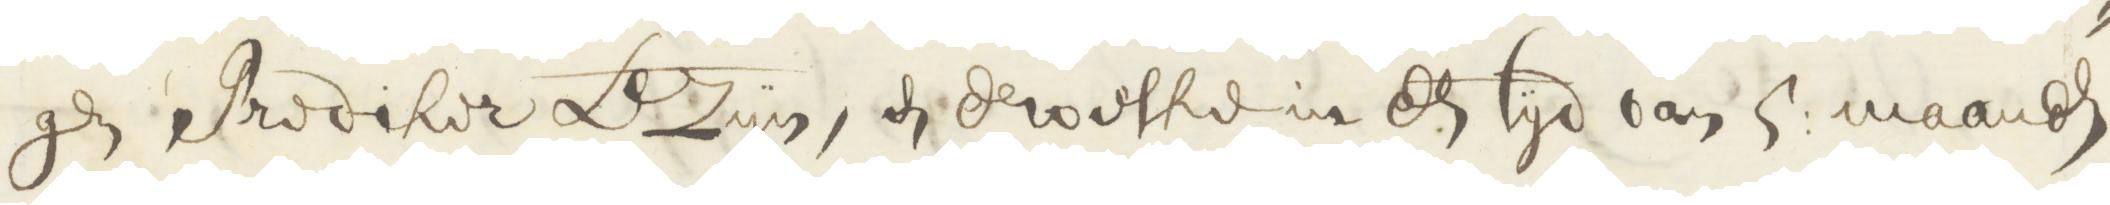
gen Prediker te zijn, en dewelke in den tijd van 5: maanden
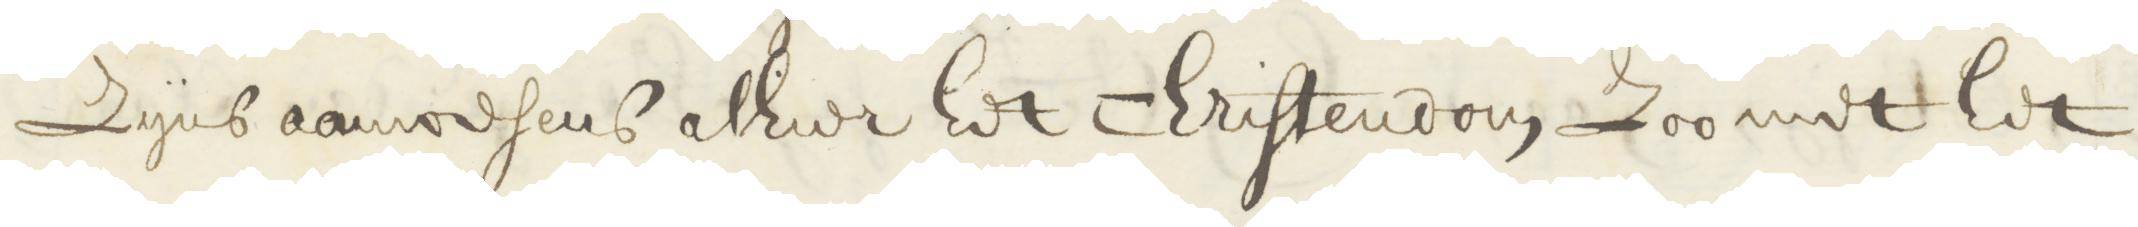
zijns aanwesens alhier het christendom zoo met het
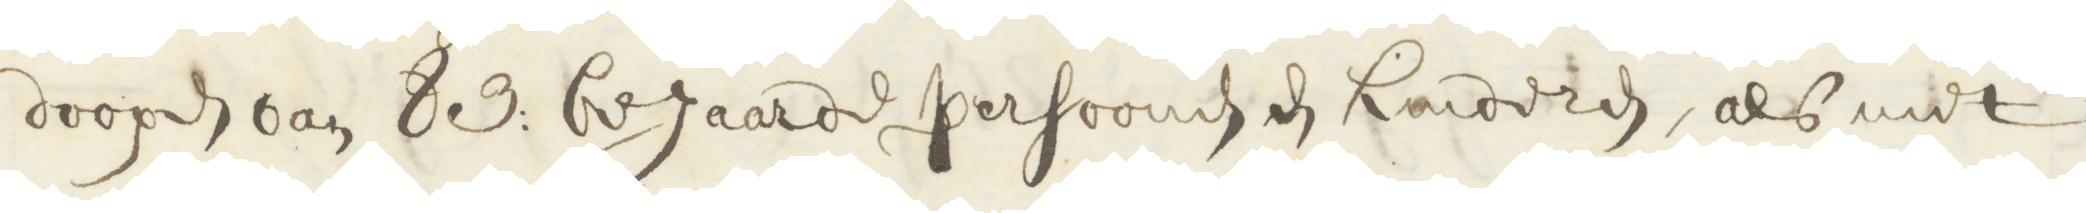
doopen van 83: bejaarde persoonen en kinderen, als met
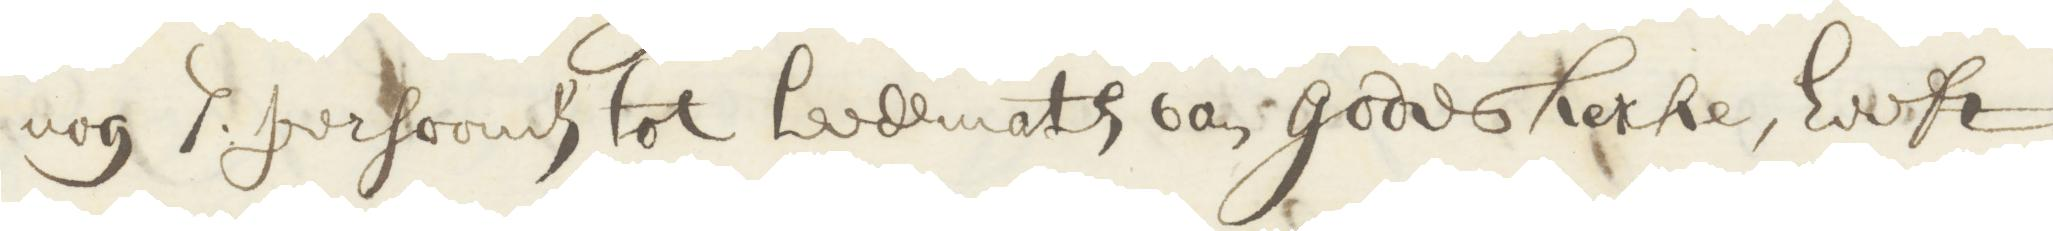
nog 7: persoonen tot leedematen van godeskerke, heeft
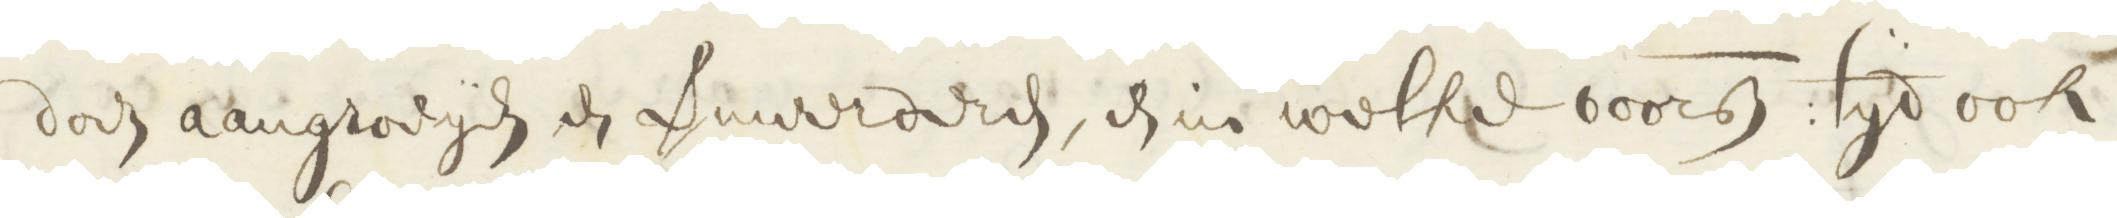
doen aangroeijen en vermeerderen, en in welke voorsz: tijd ook
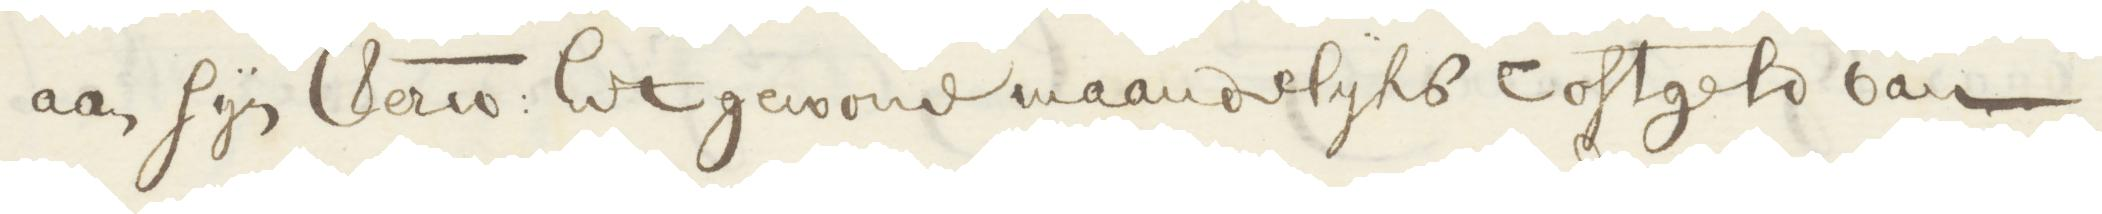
aan sijn Eerw: het gewone maandelijks costgeld van
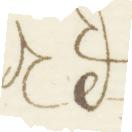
rd=s
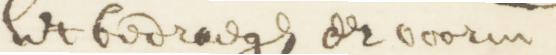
het bedraegen der voorm:
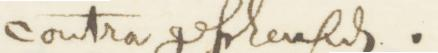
contra geschenken.
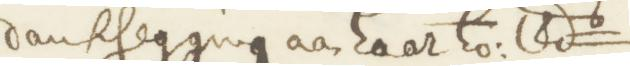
danksegging aan haar ho: Ed=s
